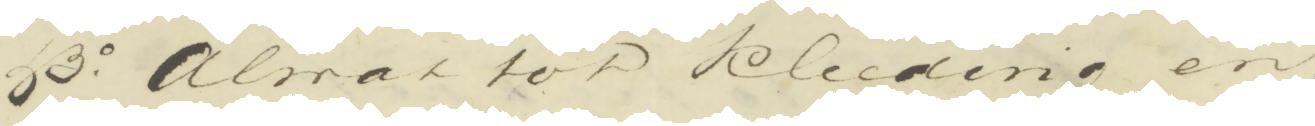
3.o Alwat tot kleeding en
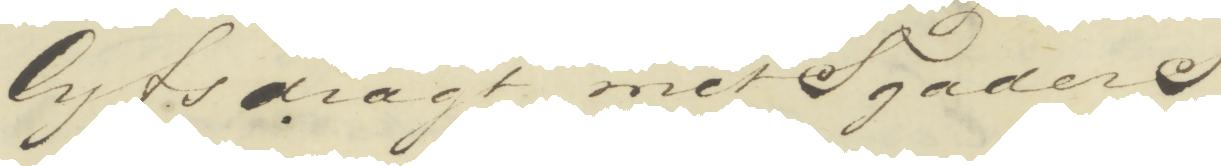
lyfsdragt mitsgaders
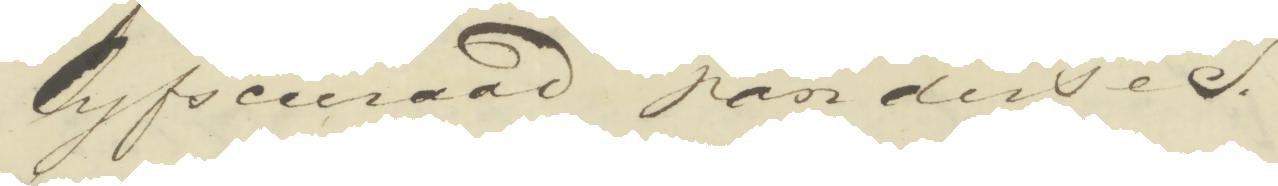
lyfscieraad van deeses.
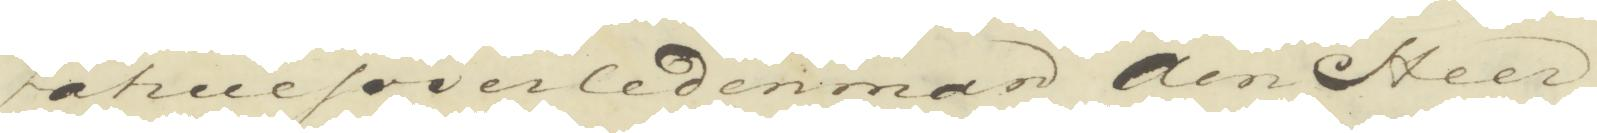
te huis overleden man den Heer
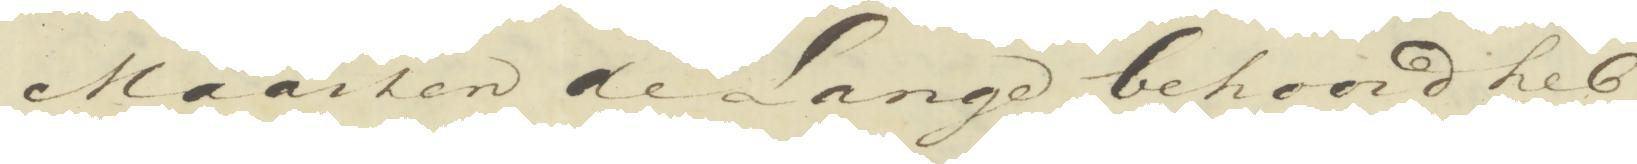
Maarten de Lange behoord heb
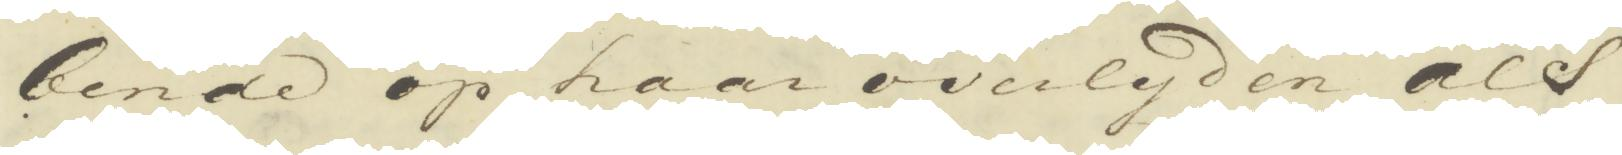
bende op haar overlyden als
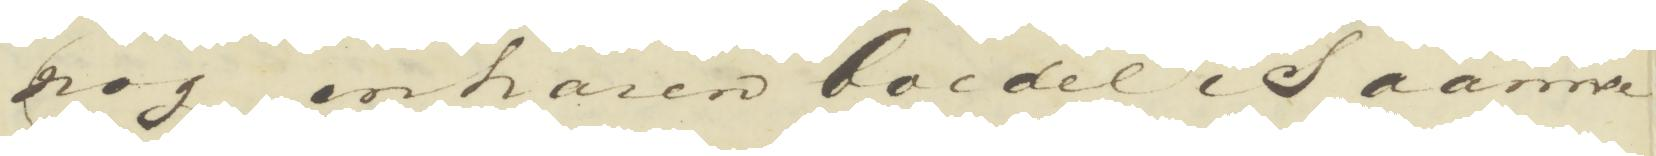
nog in haren boedel is aanwe
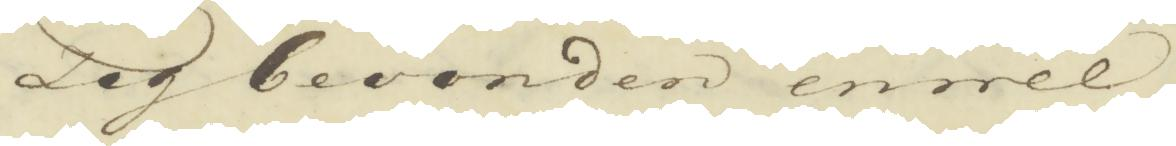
zig bevonden en wel
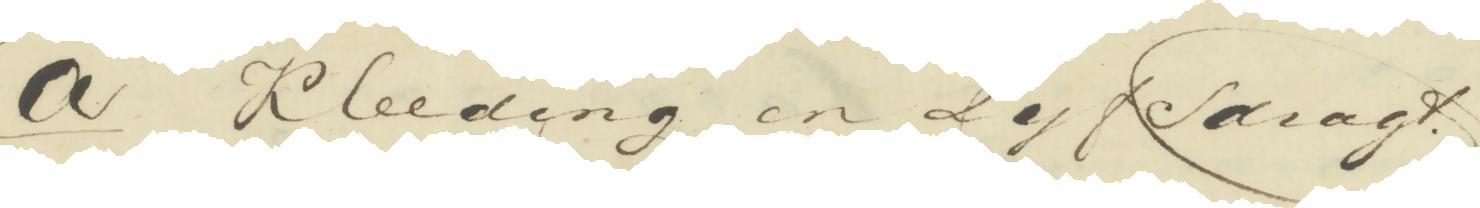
A Kleeding en Lyfsdragt.
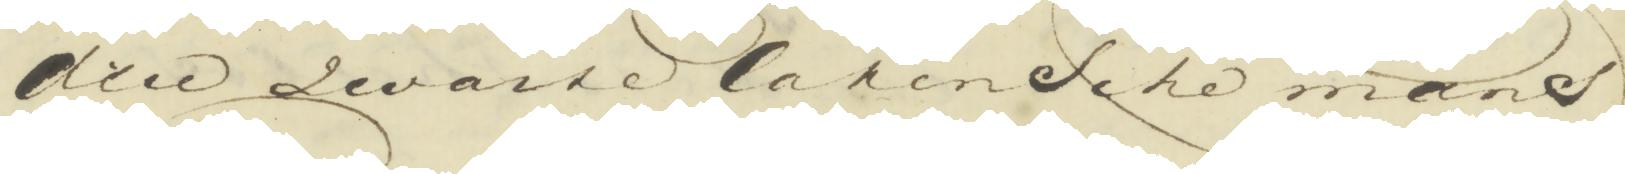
drie zwarte lakensche mans
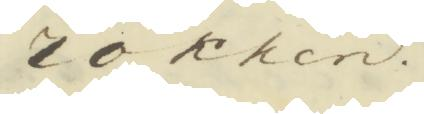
rokken.
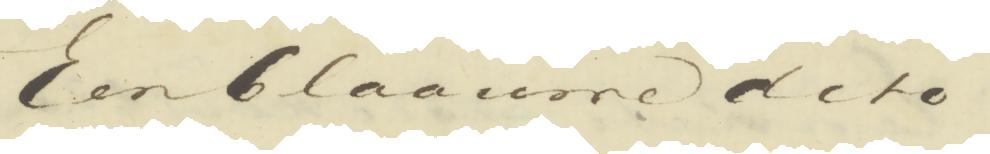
Een blaauwe dito
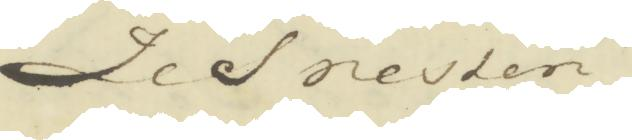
Zes vesten
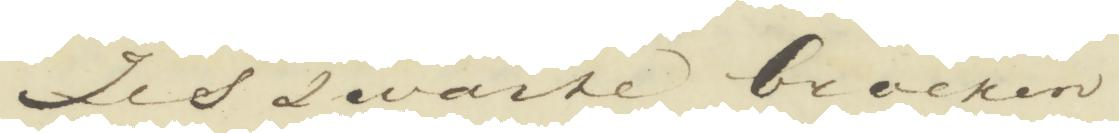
Zes zwarte broeken
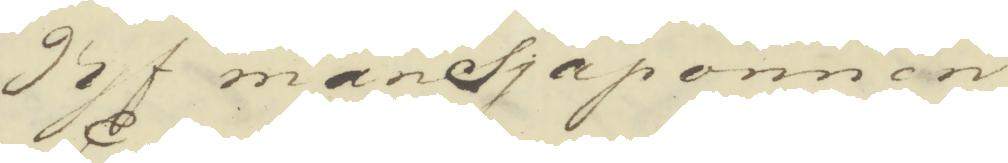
Vyf mansjaponnen
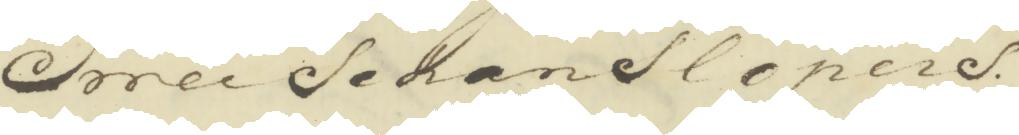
Twee Schanslopers.
